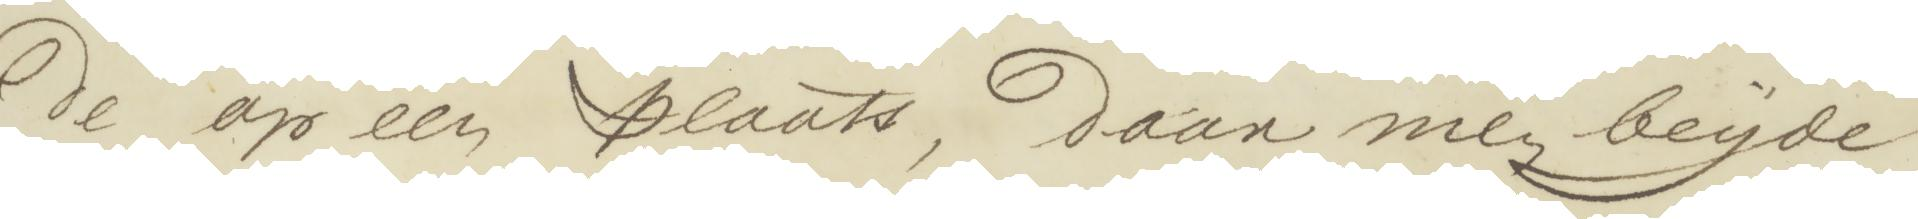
de op een plaats, daar men beijde
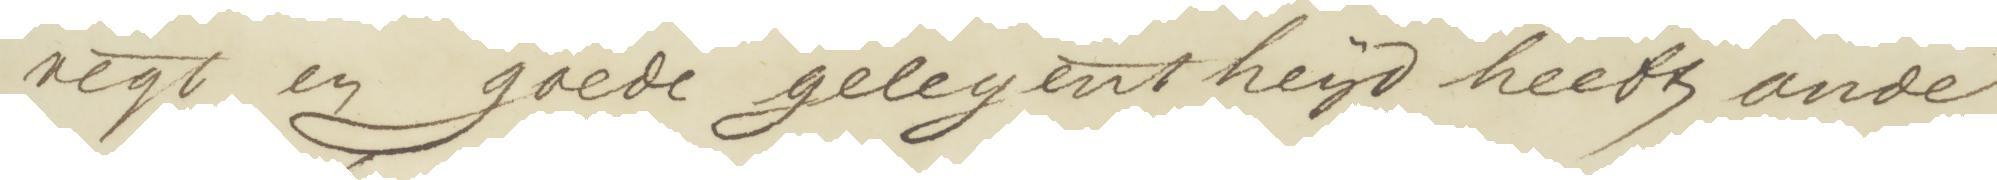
regt en goede gelegent heijd heeft ande
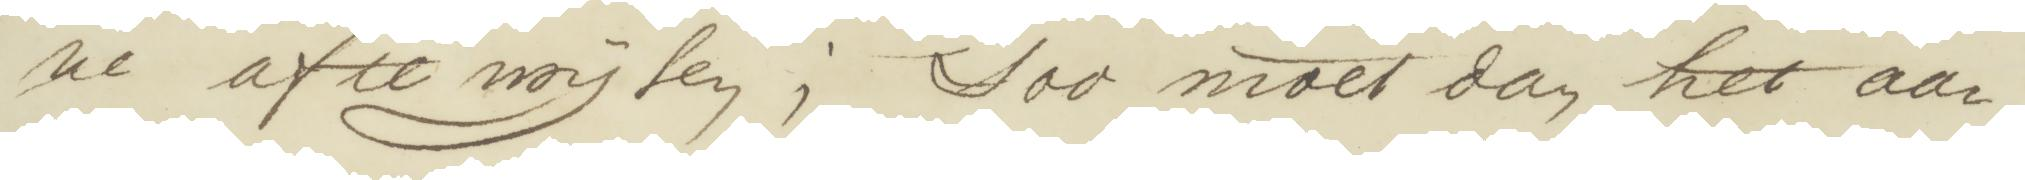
re af te wijsen; soo moet dan het aan
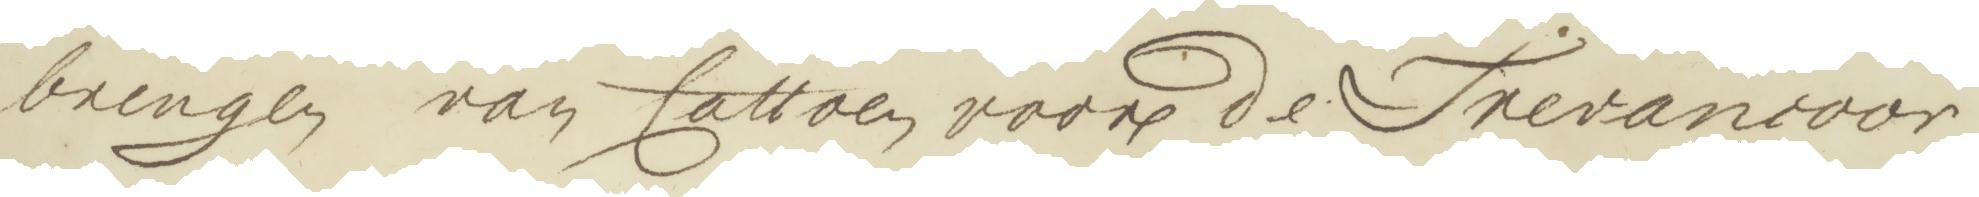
brengen van Cattoen voor de Trevancoor
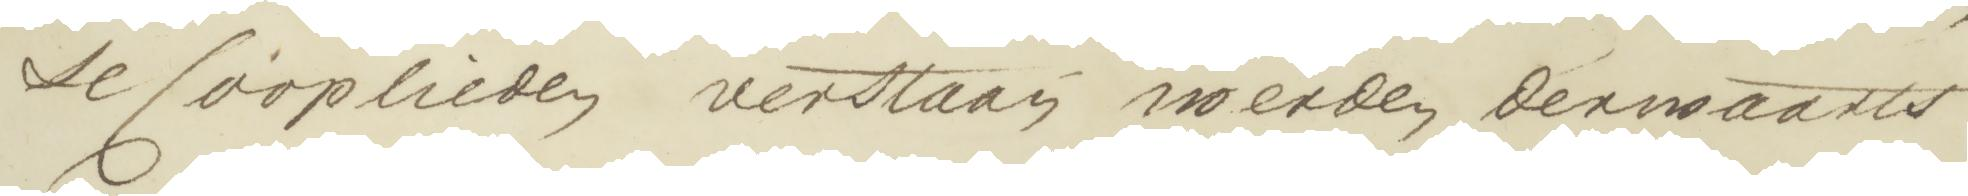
se Cooplieden verstaan werden derwaarts
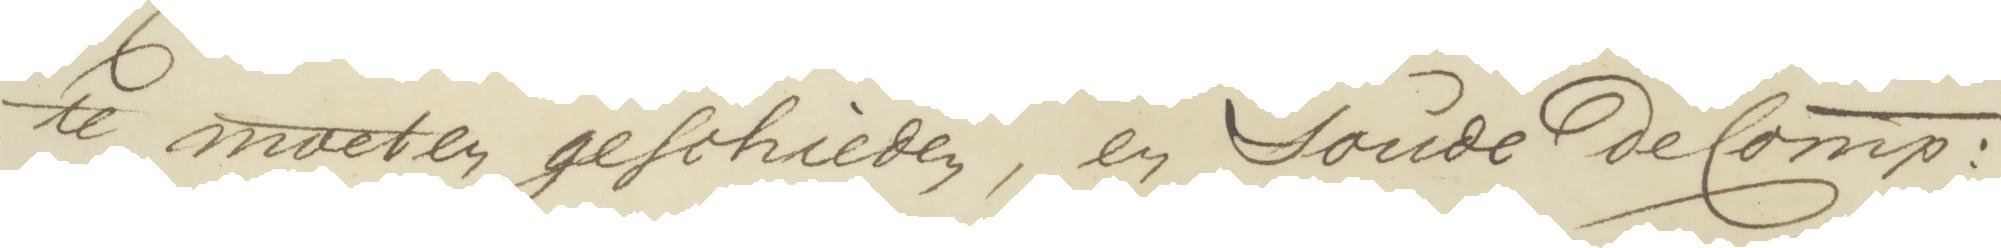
te moeten geschieden, en soude de Comp:
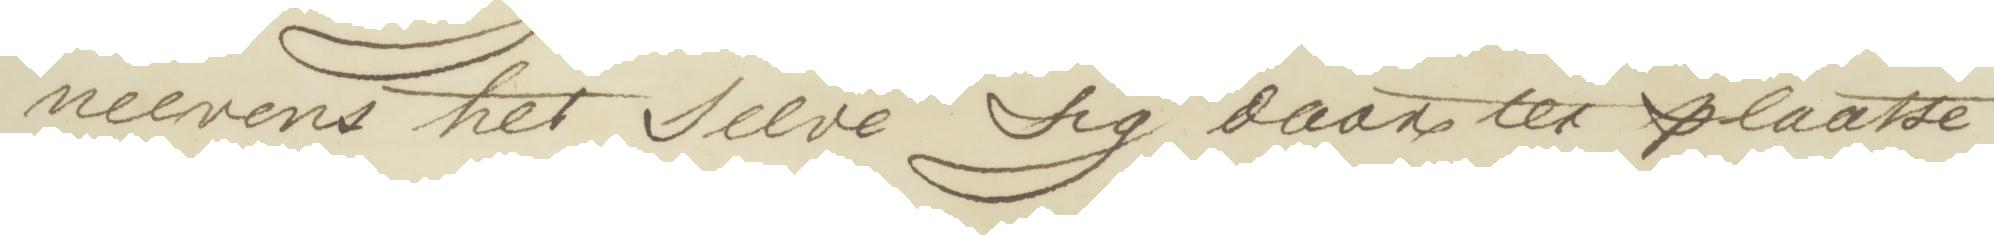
neevens het selve sig daar ter plaatse
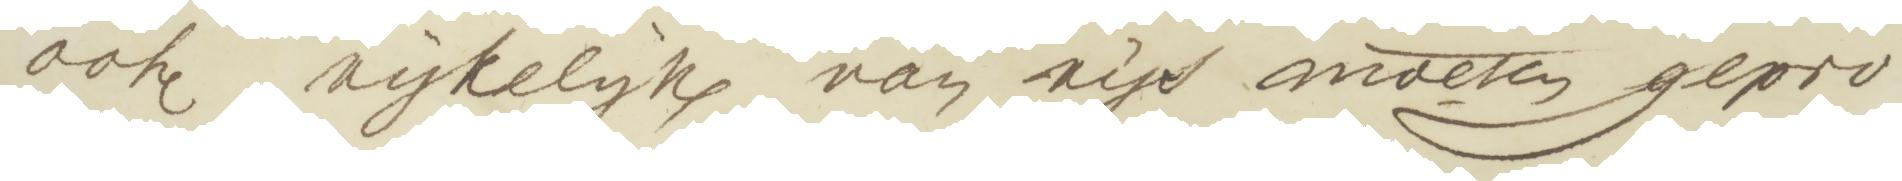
ook rijkelijk van rijs moeten gepro,
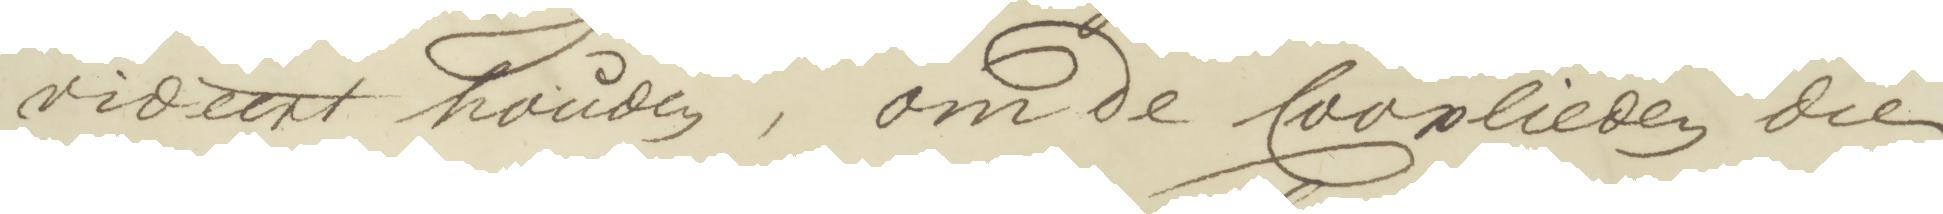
videert houden, om de Cooplieden die
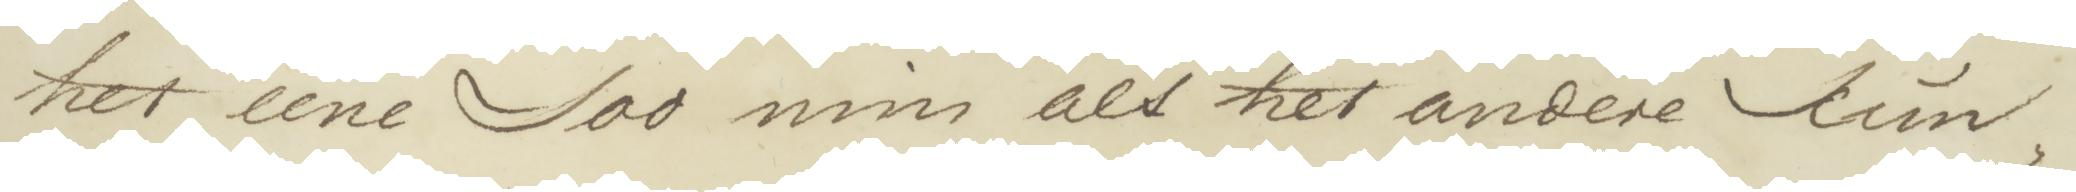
het eene soo min als het andere kun„
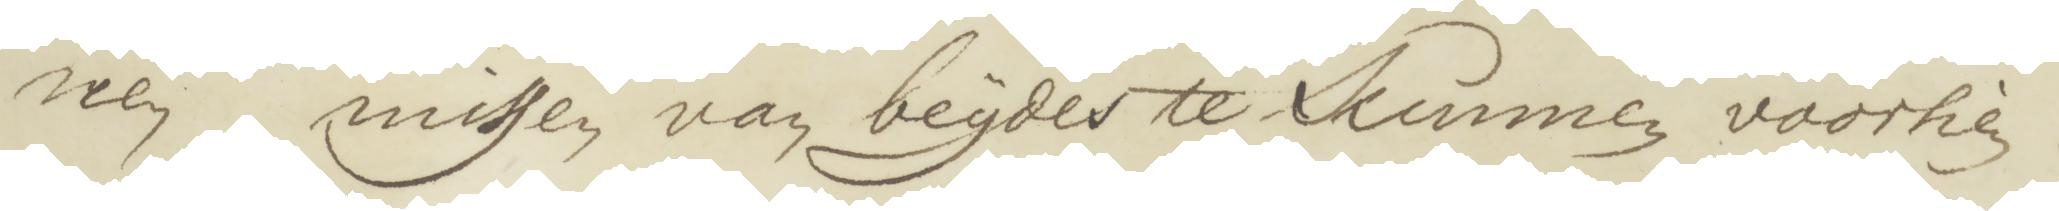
nen missen van beijdes te kunnen voorsien.
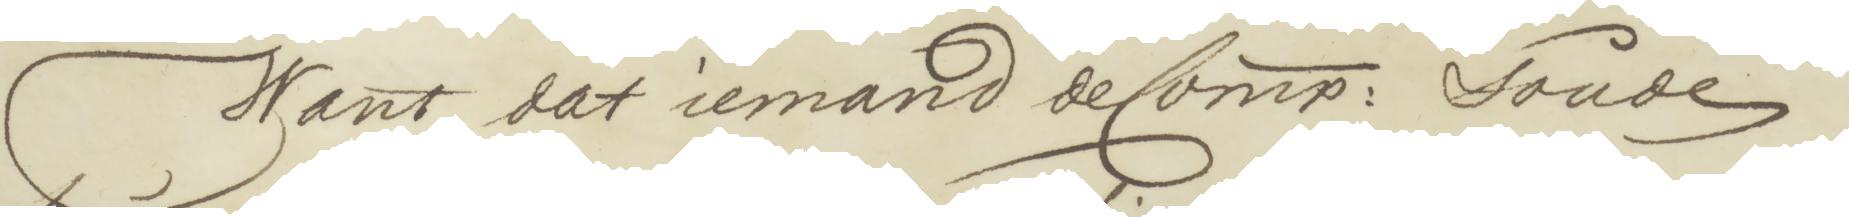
Want dat iemand de Comp: soude
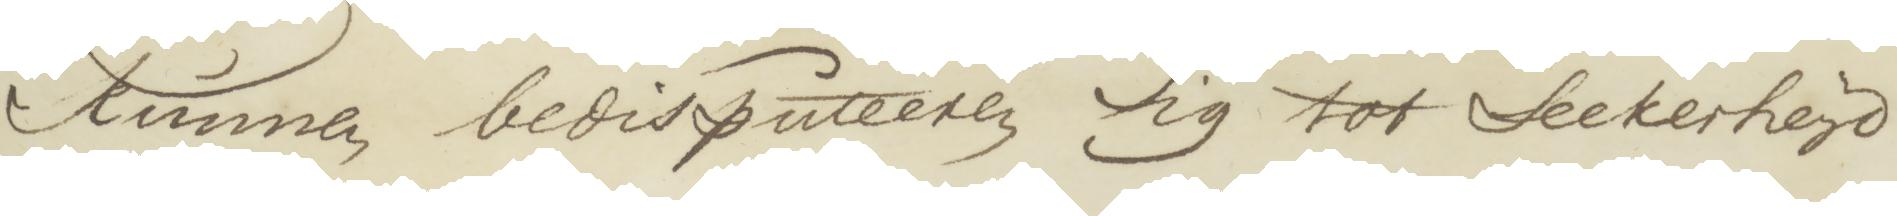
kunnen bedisputeeren sig tot seekerheijd
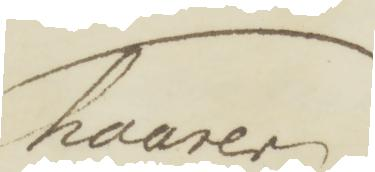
haaren
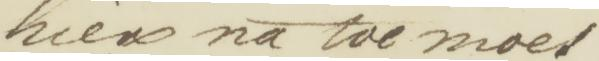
hier na toe moet
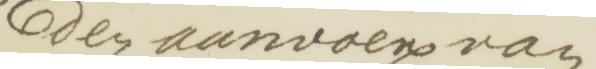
den aanvoer van
